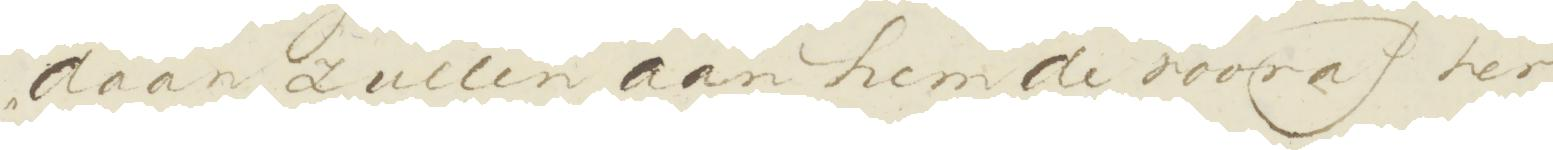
„daan, zullen aan hem de vooraf ter
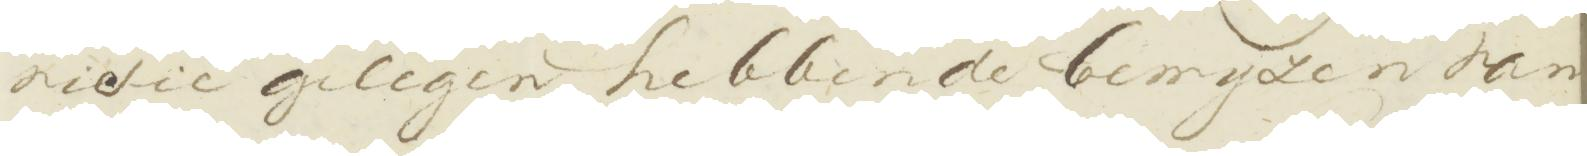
visie gelegen hebbende bewyzen van
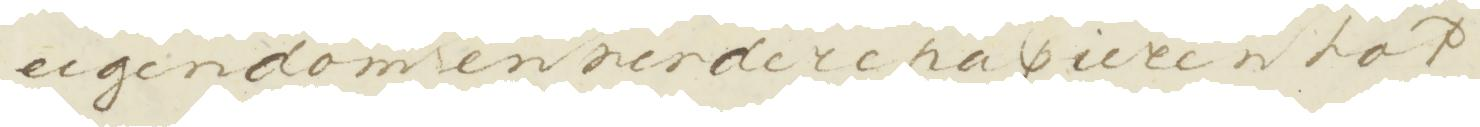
eigendom en verdere papieren tot
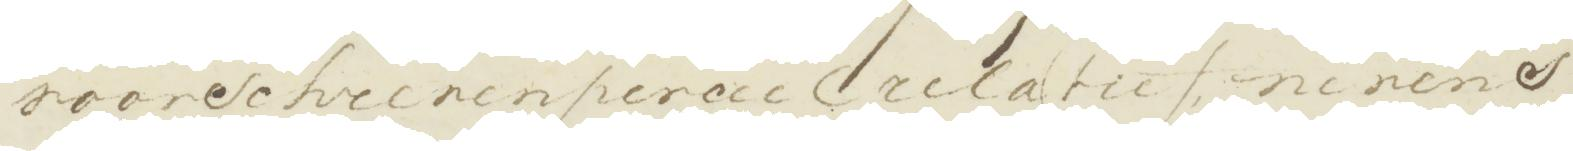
voorschreven perceel relatief, nevens
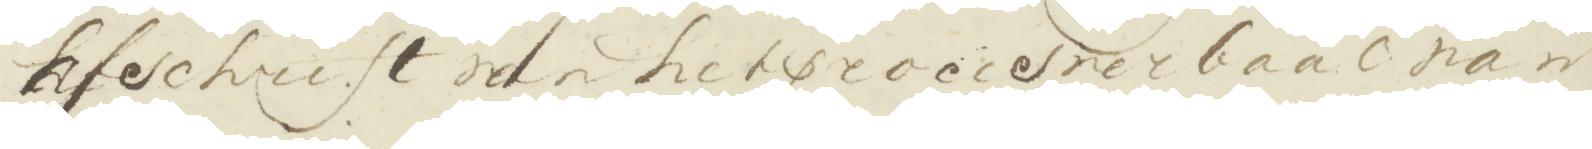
afschrift van het procesverbaal van
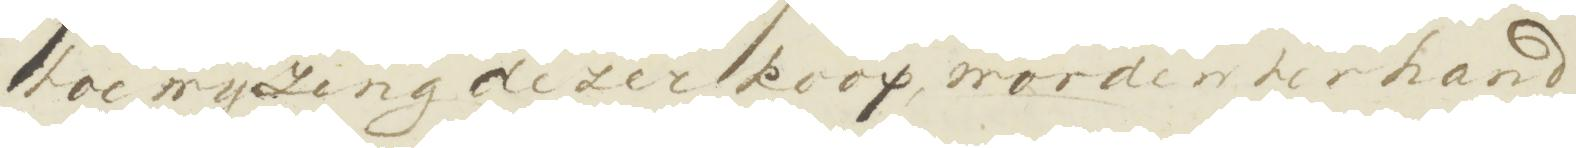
toewyzing dezer koop, worden ter hand
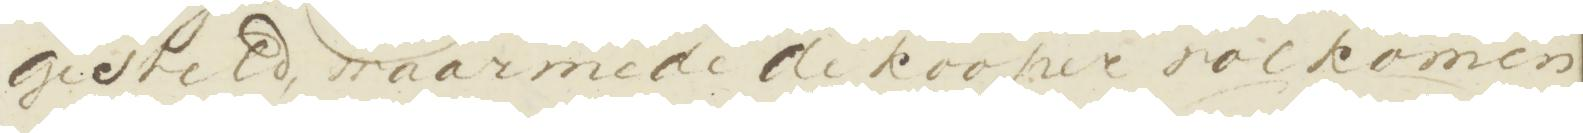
gesteld, waarmede de kooper volkomen
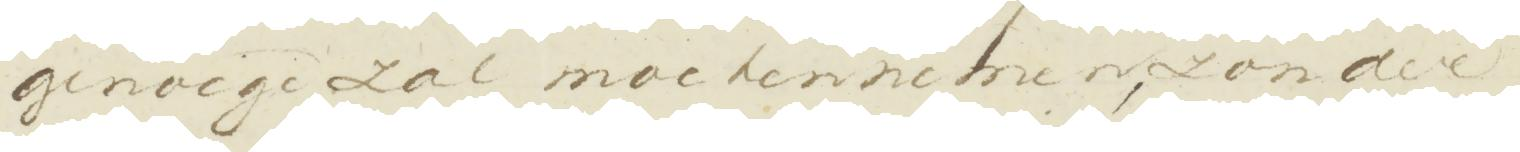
genoege zal moeten nemen, zonder
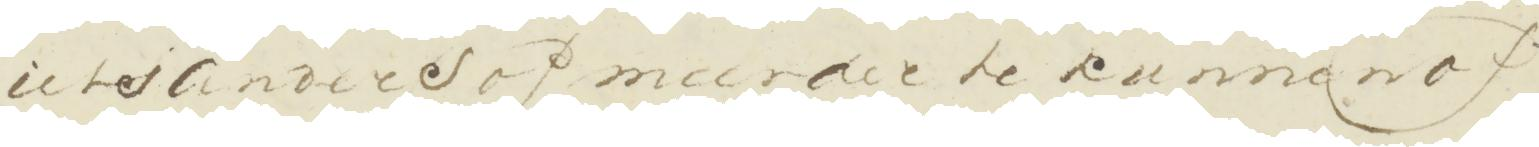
iets anders of meerder te kunnen of
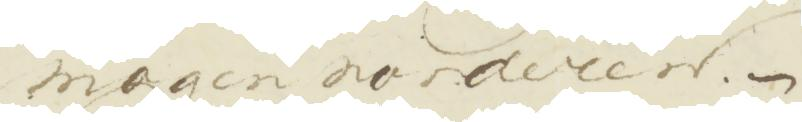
mogen vorderen.
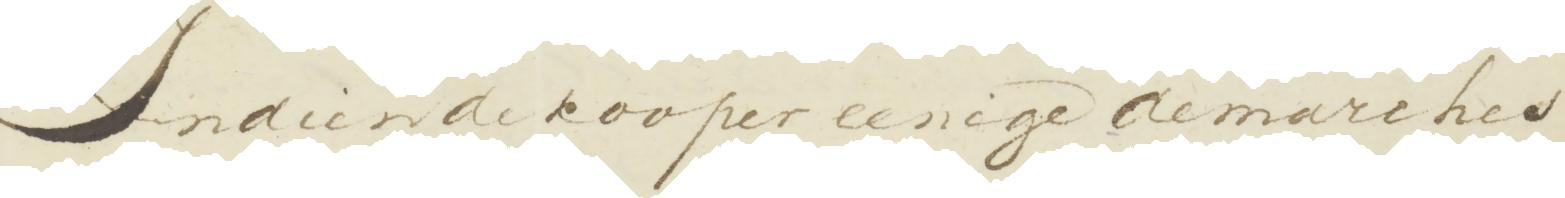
Jndien de kooper eenige demarches
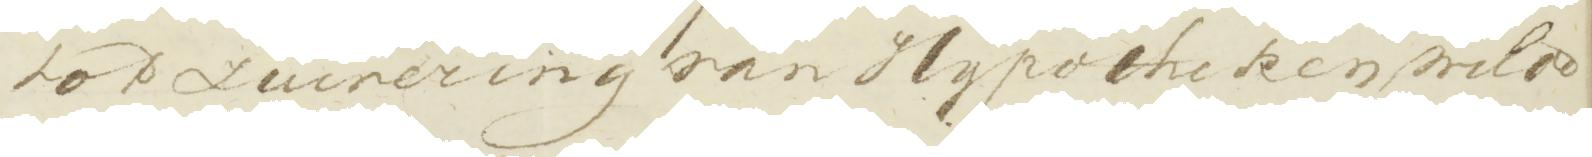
tot zuivering van Hypotheken wilde
